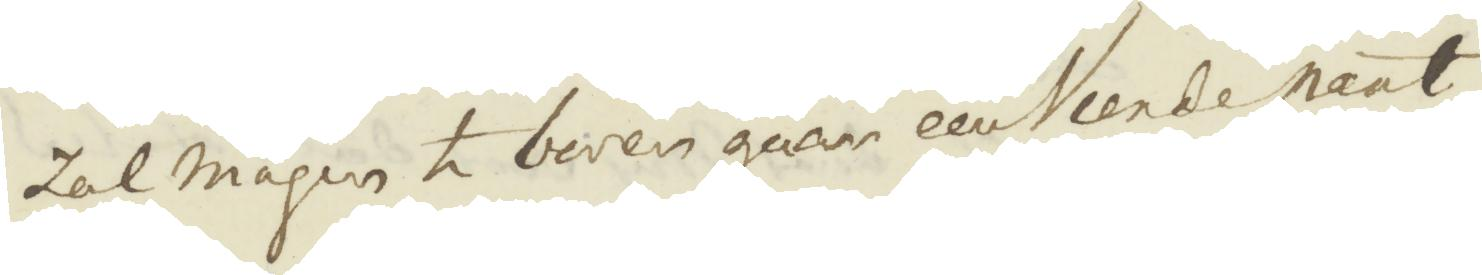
zal mogen te boven gaan een Vierde part
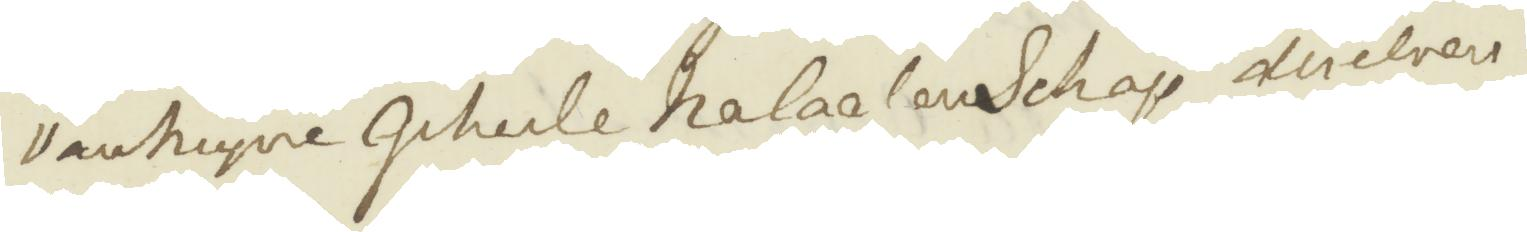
van myne geheele nalaatenschap deselven
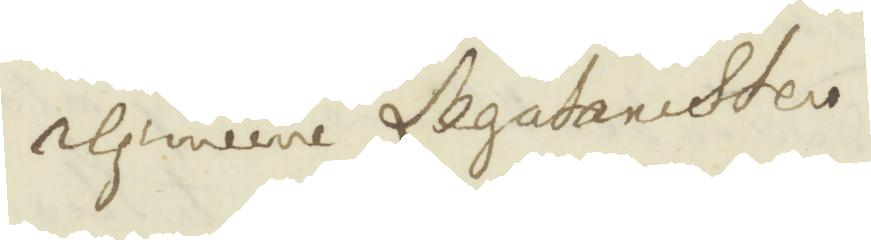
algemeene Legatarissen
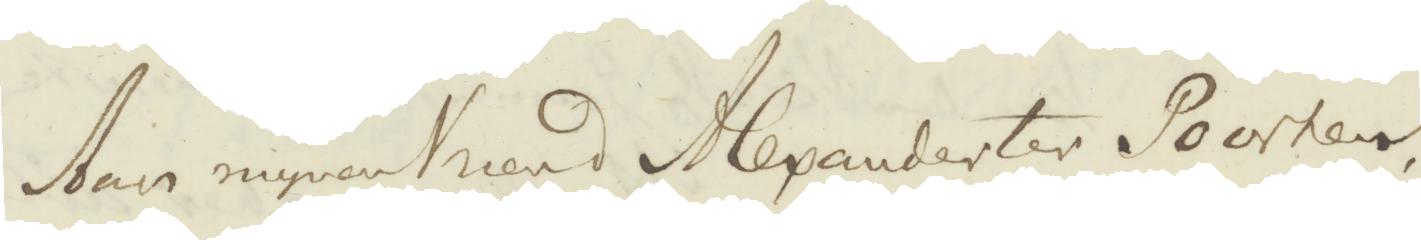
Aan mijne Vriend Alexander ter Poorten,
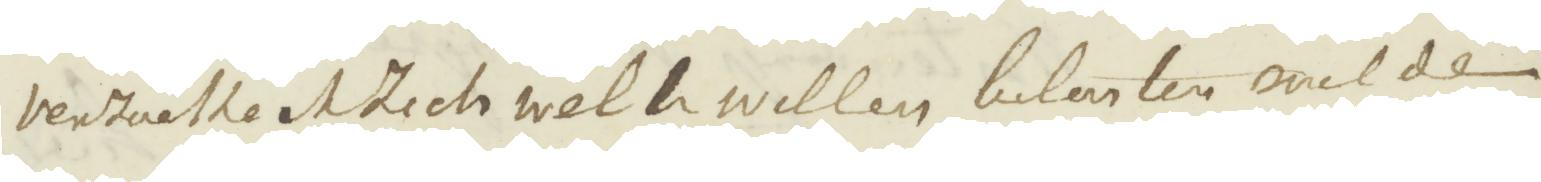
verzoeke ik zich wel te willen belasten met de
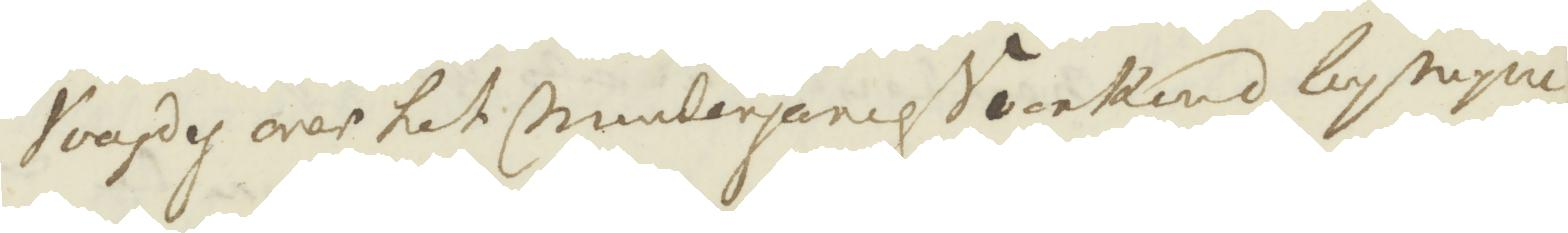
Voogdij over het minderjarig Voorkind, by myne
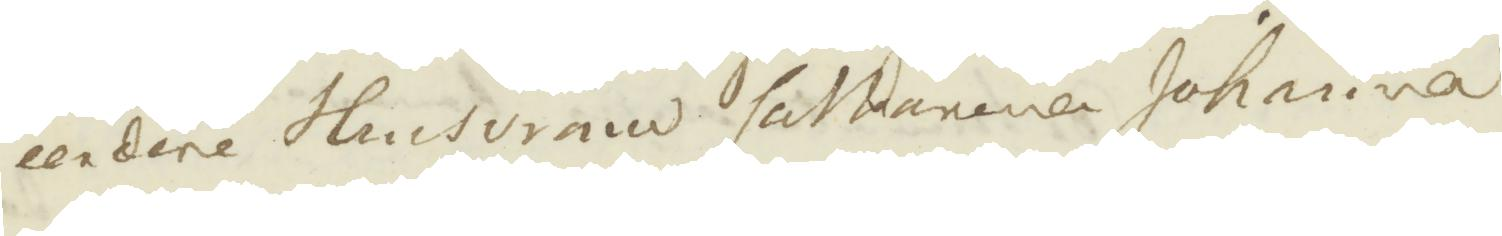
eerdere Huisvrouw Catharina Johanna
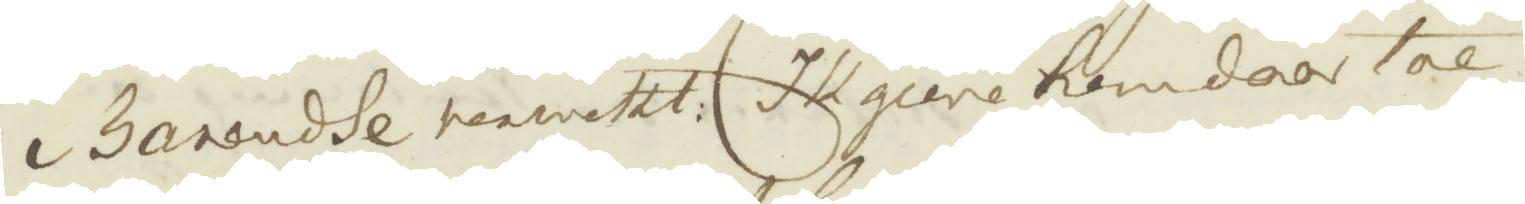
Barendse verwekt: Ik geeve hem daar toe
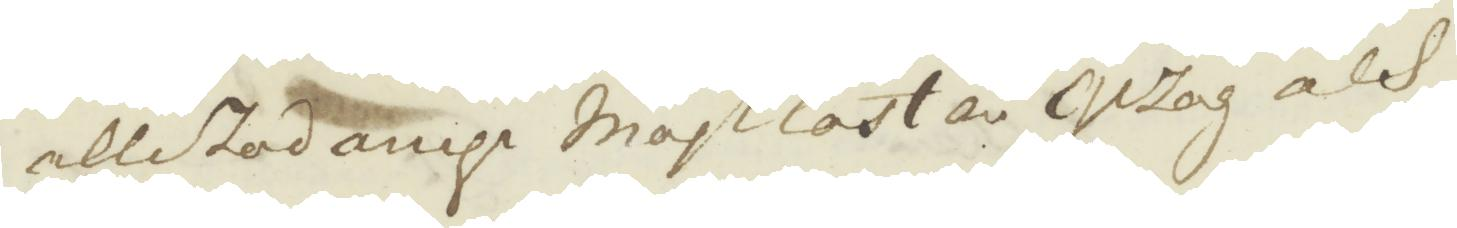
alle zodanige magt last en gezag als
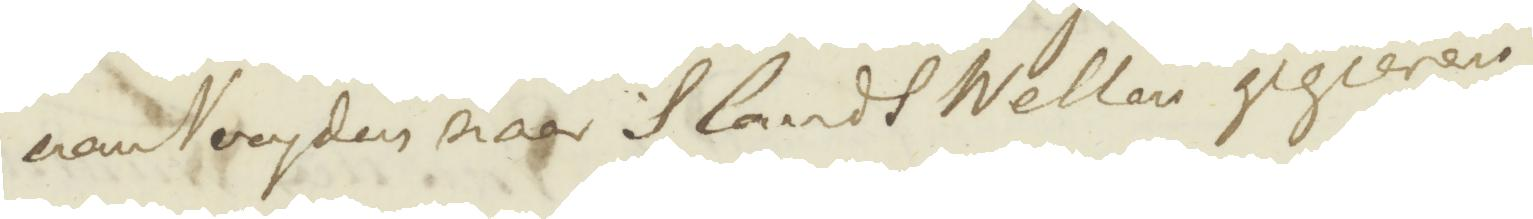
aan Voogden na 's lands Wetten gegeeven
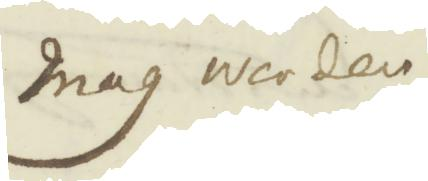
mag worden
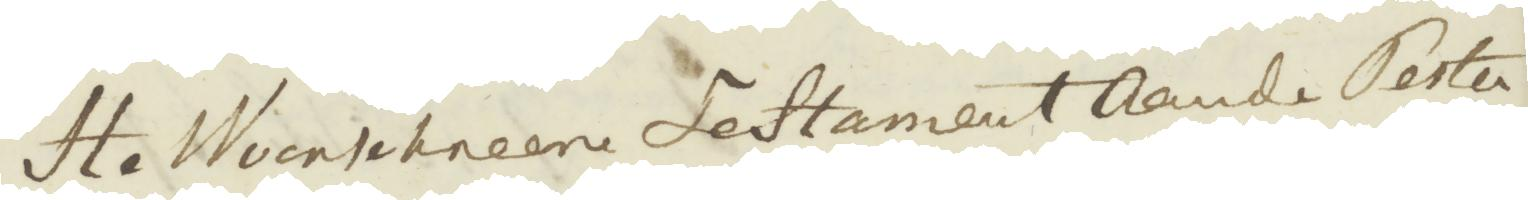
Het Voorschreeve Testament aan de Testa
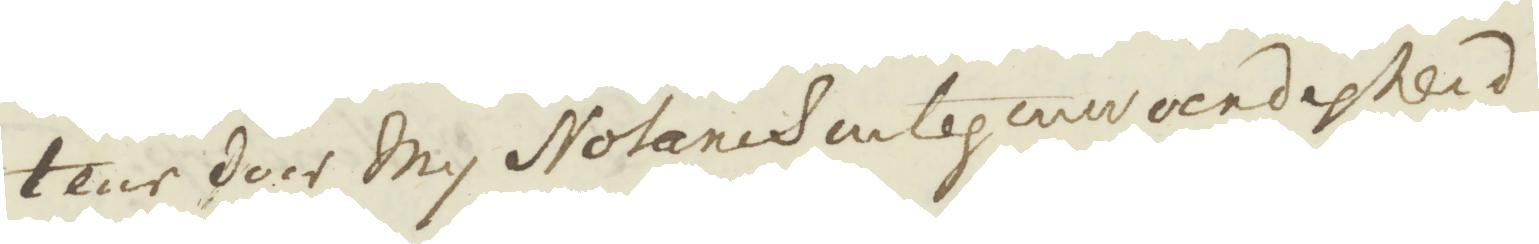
teur door my Notaris in tegenwoordigheid
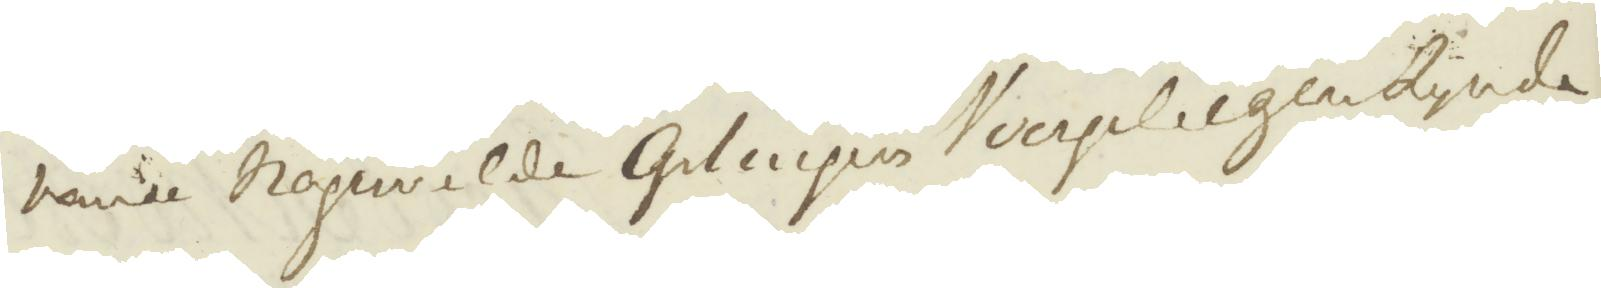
van de nagemelde getuigen Voorgeleezen zijnde,
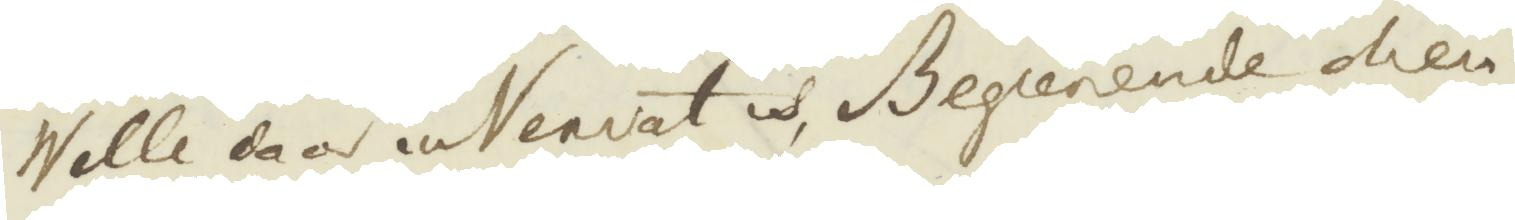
Wille daar in Vervat is, Begerende dien
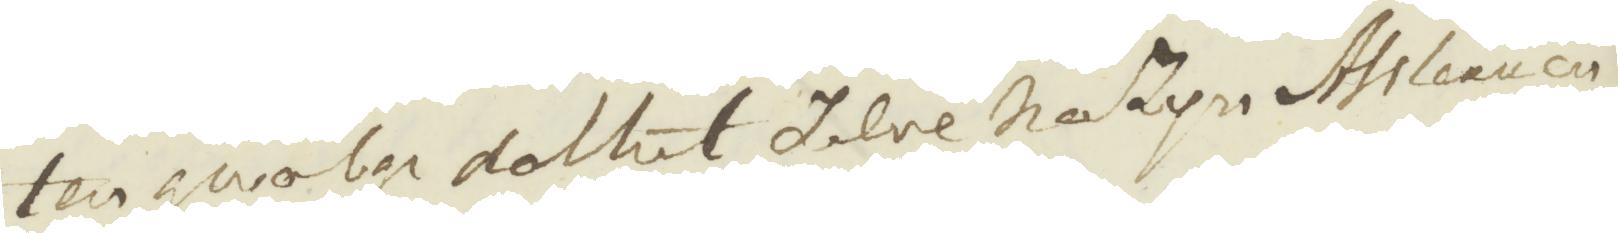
ten gevolge dat het zelve na zyn Afsterven
